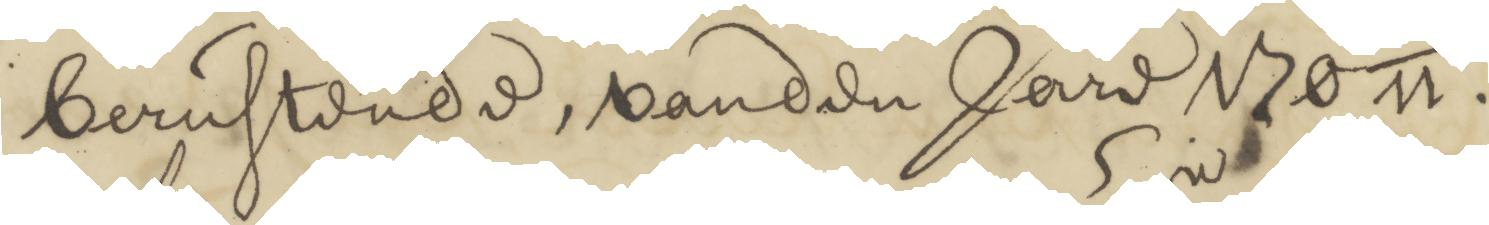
berustende, van den Jare 170 10/11.
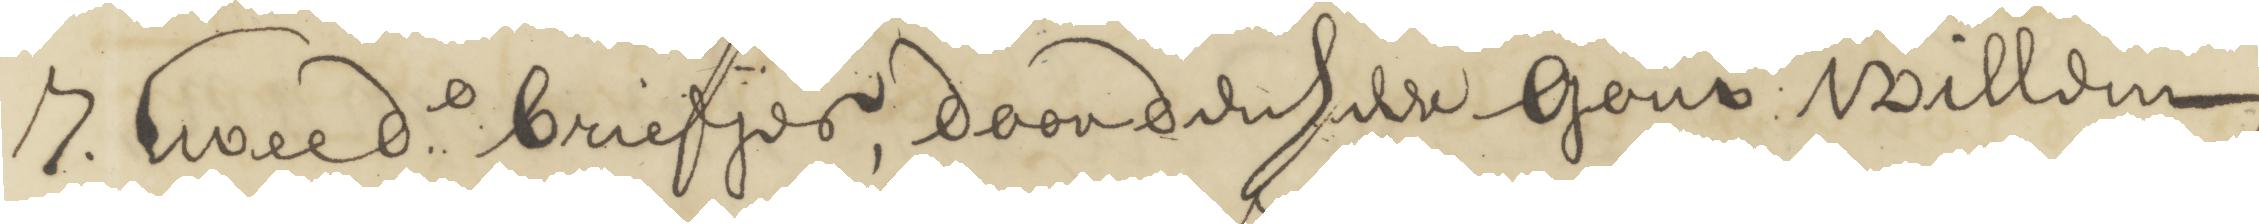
7. twee d„o briefjes, door denheer gouv:r willem
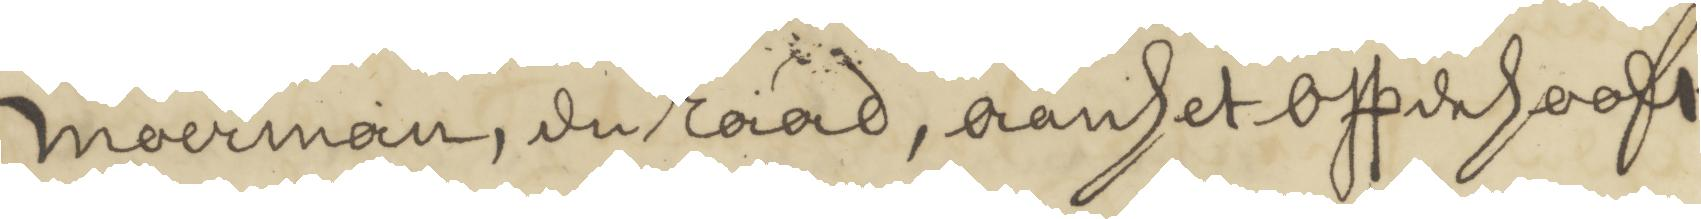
moerman, en raad, aanhet opperhooft
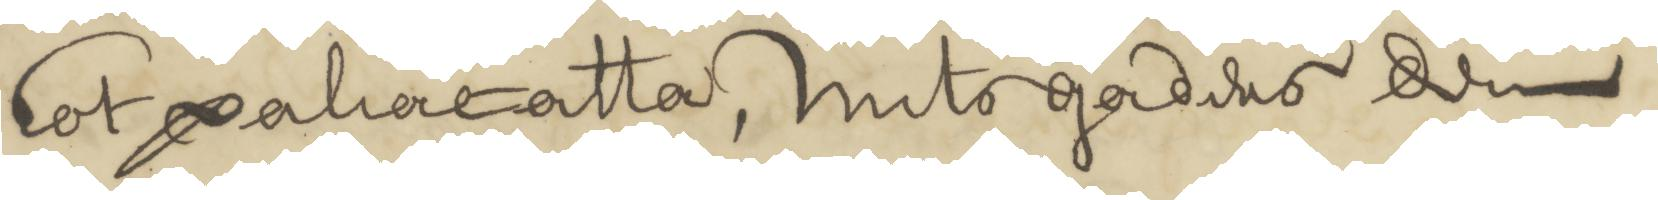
tot paliacatta, mitsgaders den
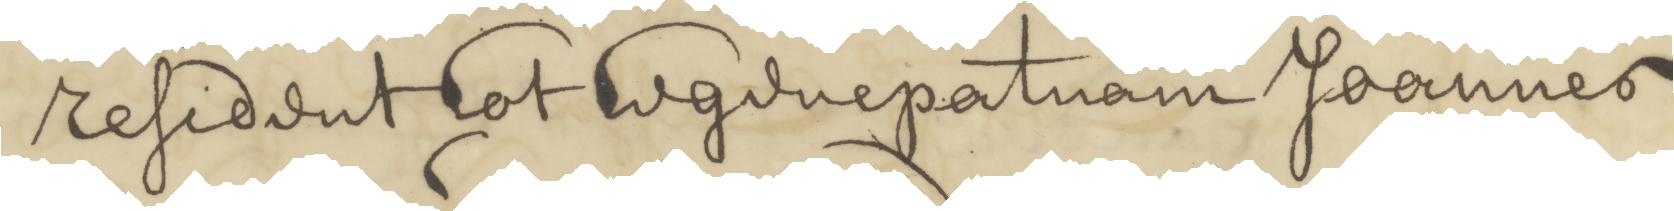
resident tot tegenepatnam Joannes
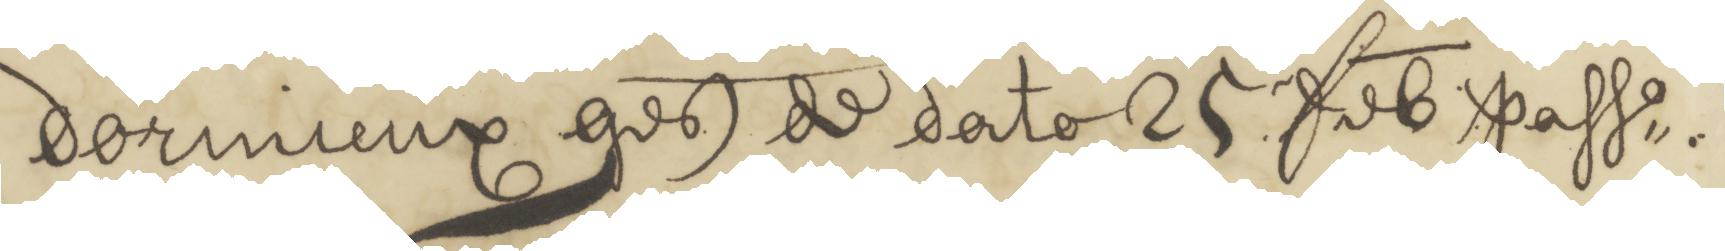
dormieux ges: de dato 25.' feb: pass„o.
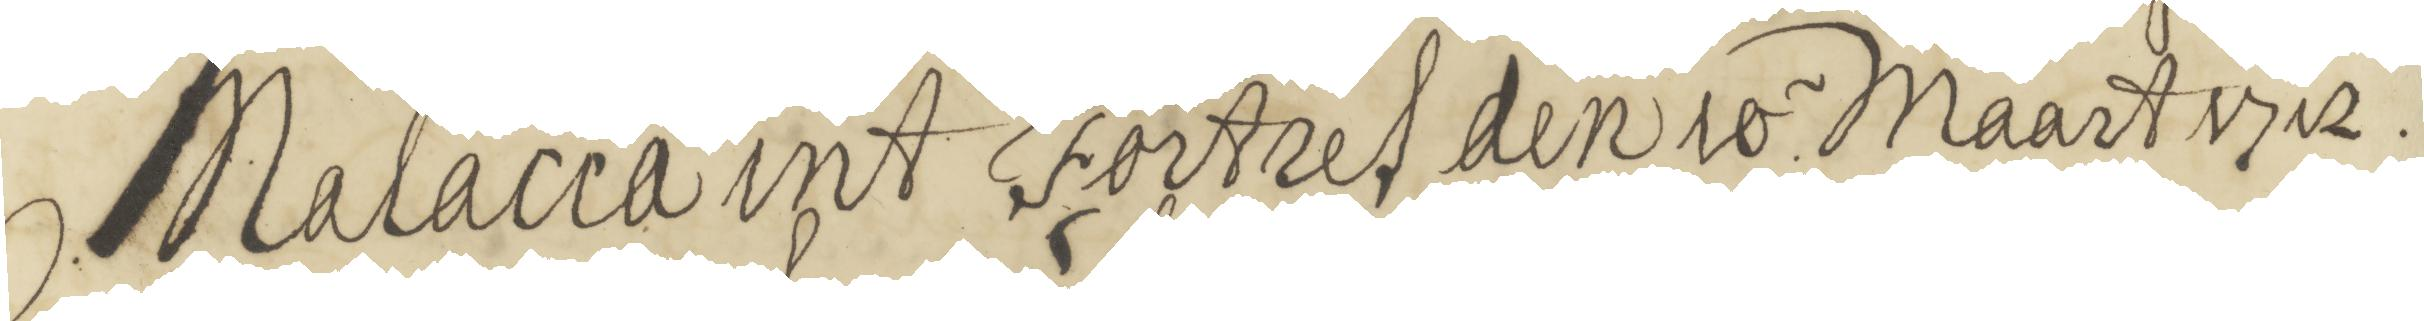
Malacca in ’t Fortres den 10.' Maart 1712.
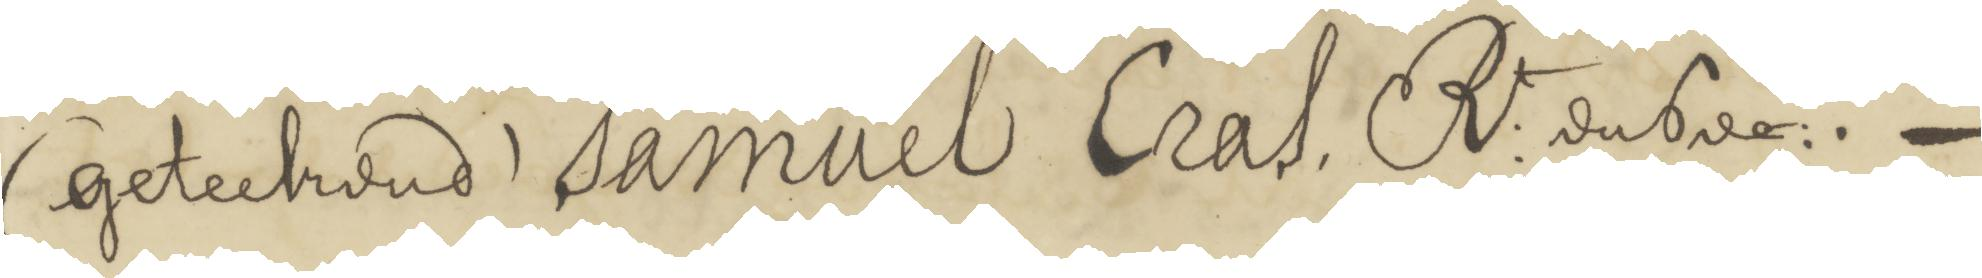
(geteekend) Samuel Cras. R:t ensec:s. -
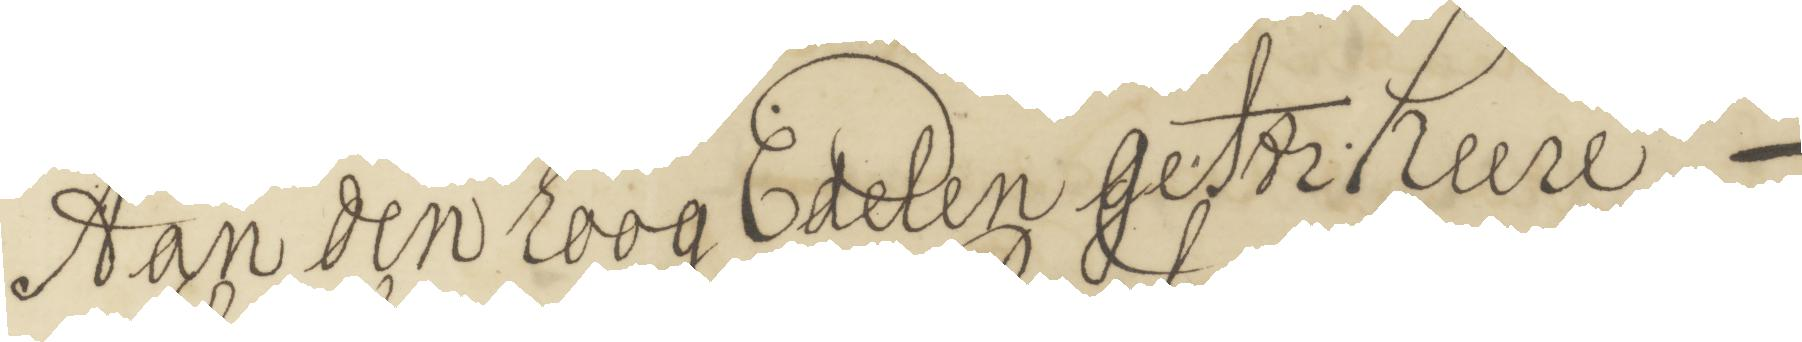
Aan den hoog Edelen gestr. heere -
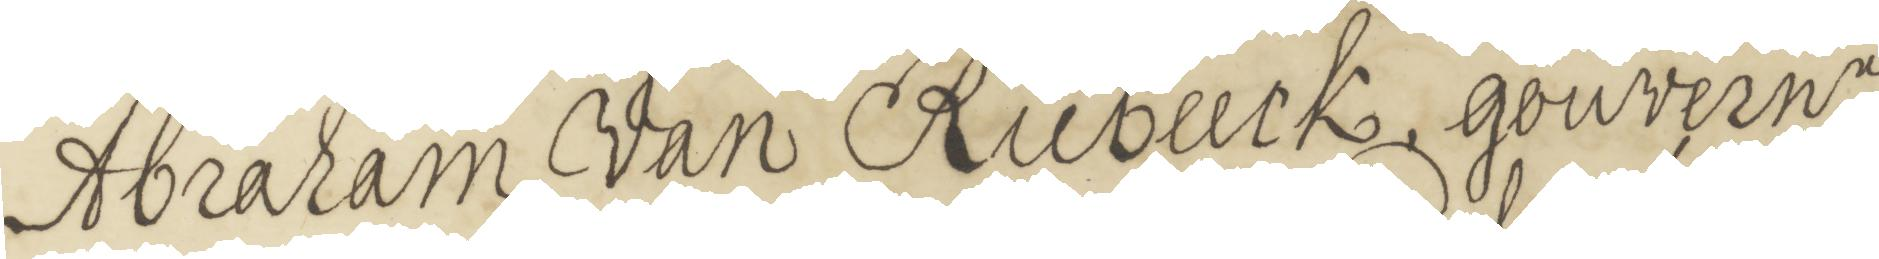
Abraham van Riebeeck, gouvern.r
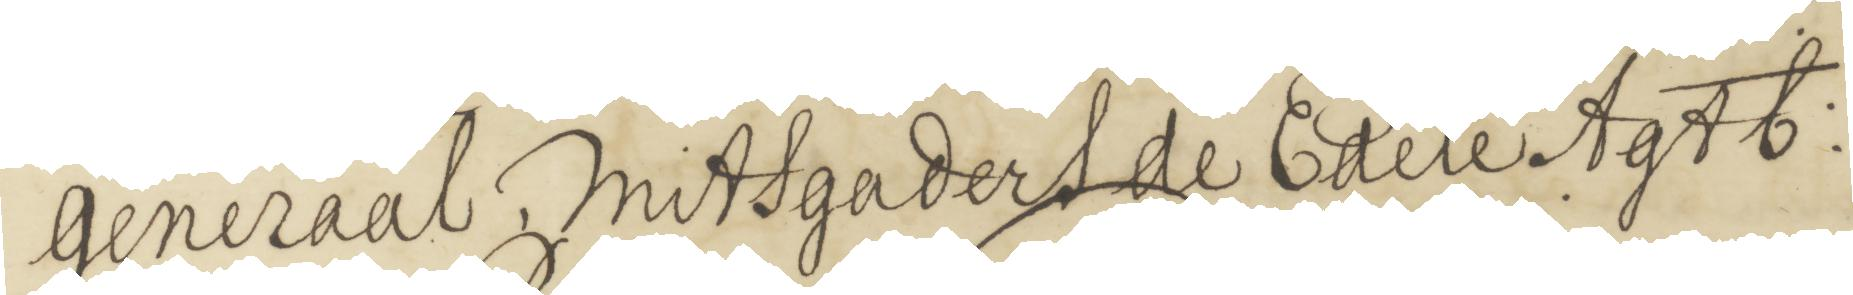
generaal, mitsgaders de Edele Agtb:
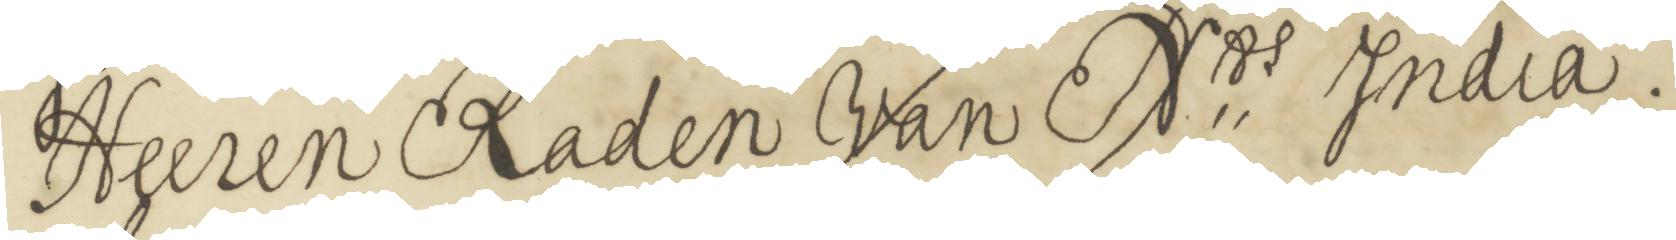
Heeren Raden van N„ds Jndia.
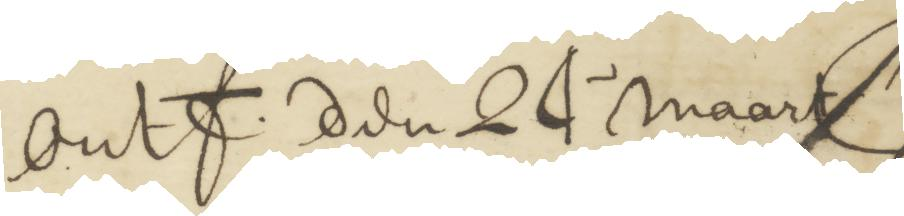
ontf: den 24' maart
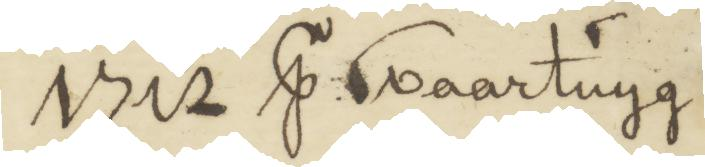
1712 p:r t vaartuyg
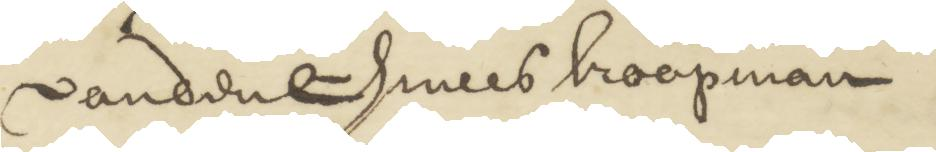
vandenChinees koopman
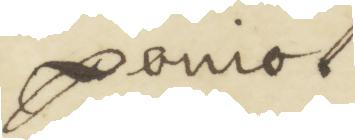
ponio.
